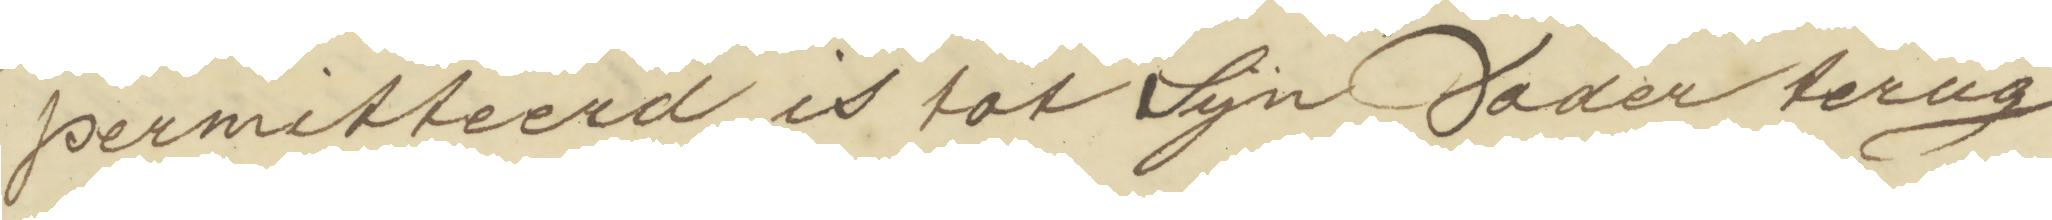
permitteerd is tot sijn vader terug
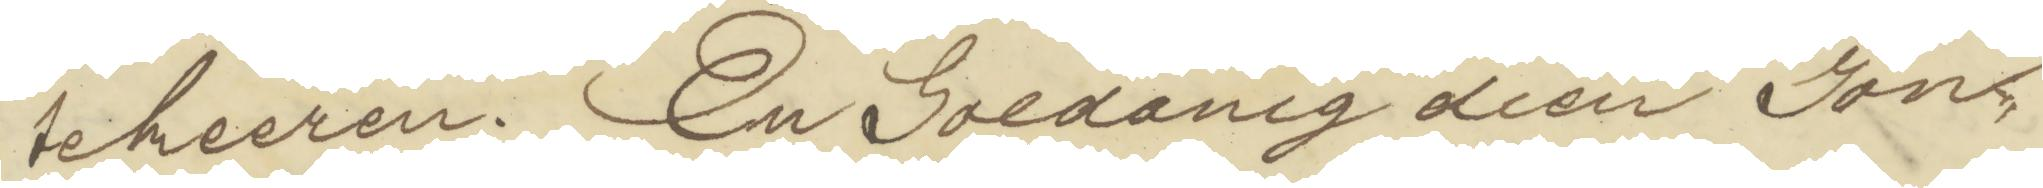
tekeeren. En hoedanig dien Ion„
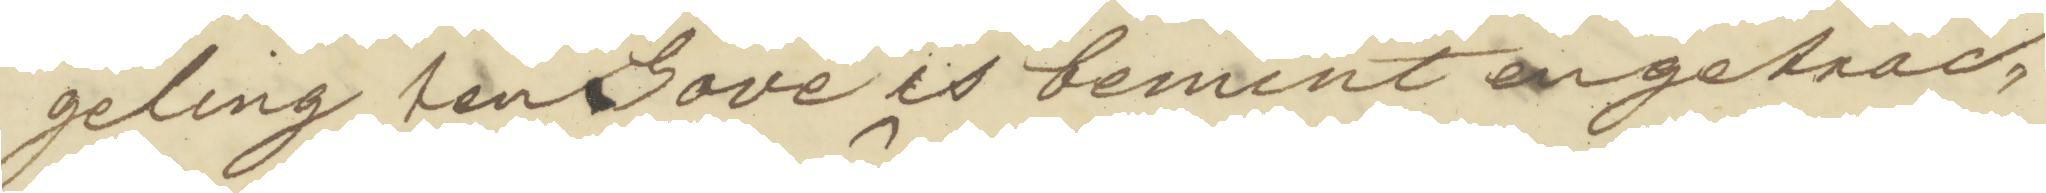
geling ten hove is bemint en getrac„
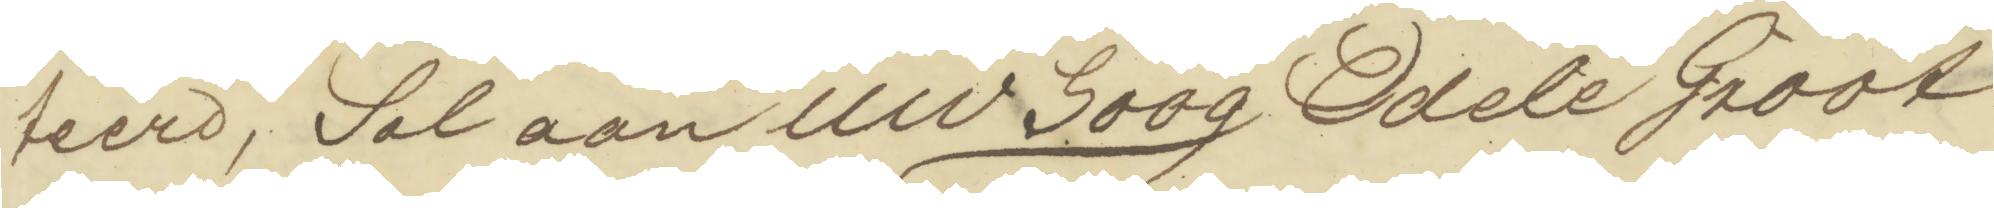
teerd, sal aan uw hoog Edele Groot
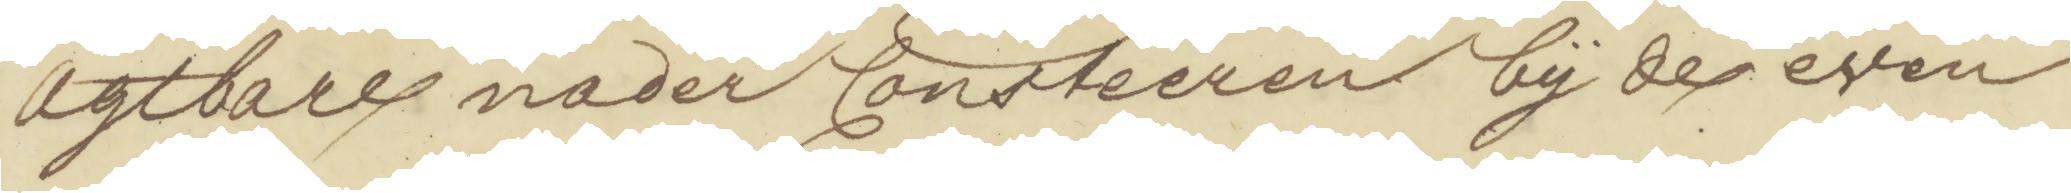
agtbare nader Consteeren bij de even
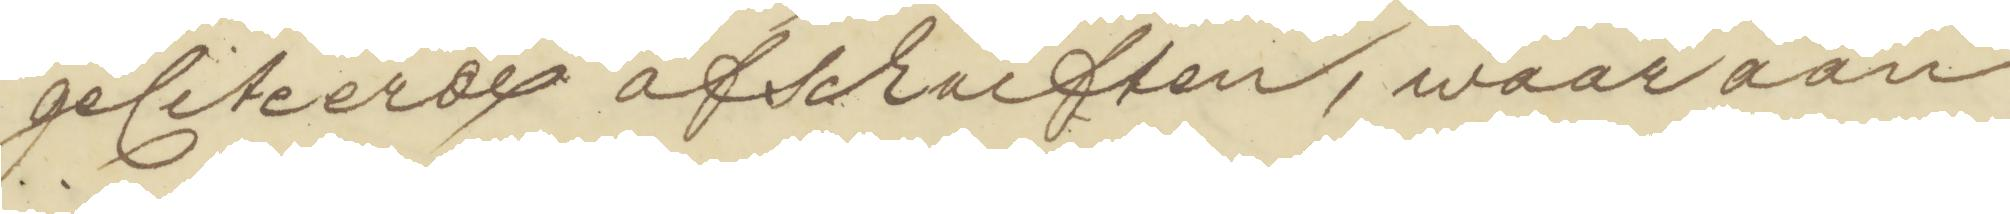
geciteerde afschriften, waar aan
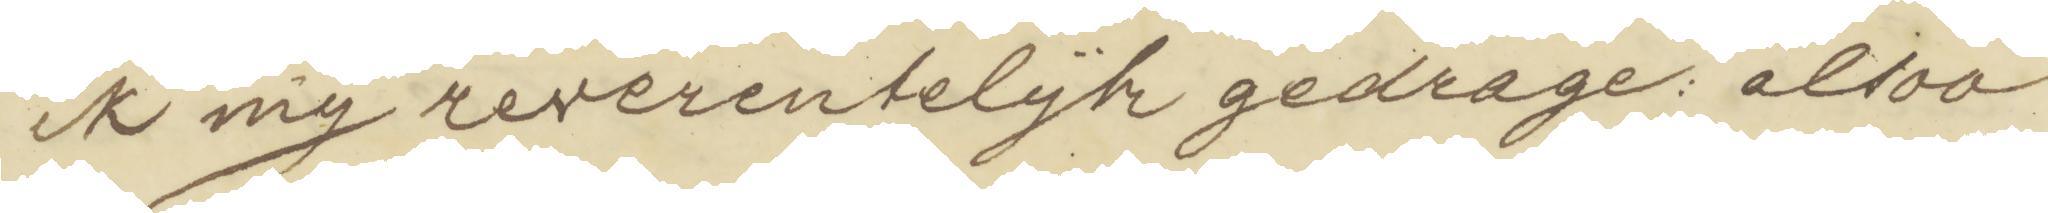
ik mij reverentelijk gedrage: alsoo
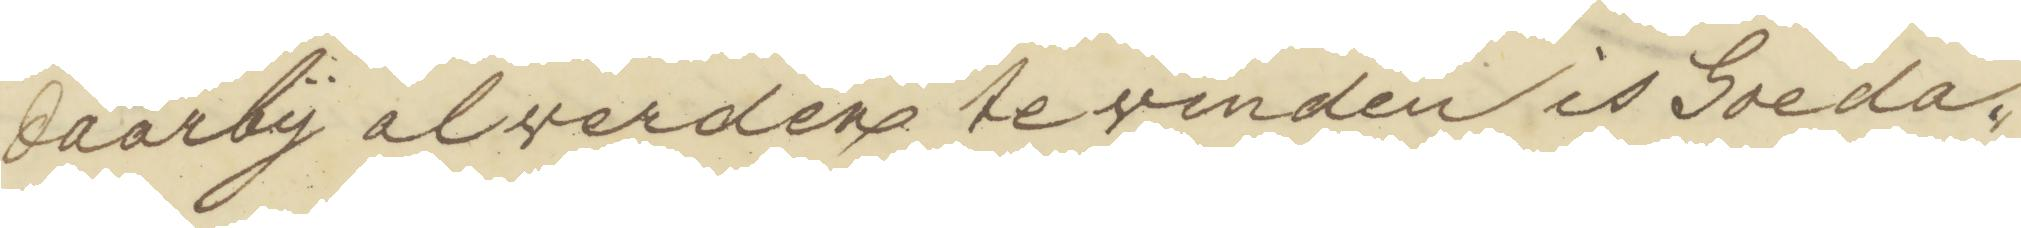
daarbij al verder te vinden is hoeda„
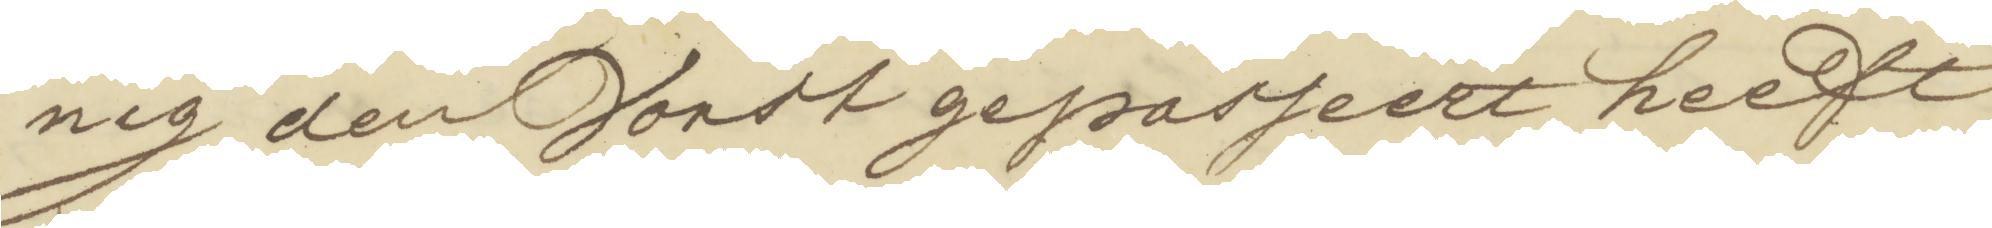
nig den Vorst gepasseert heeft
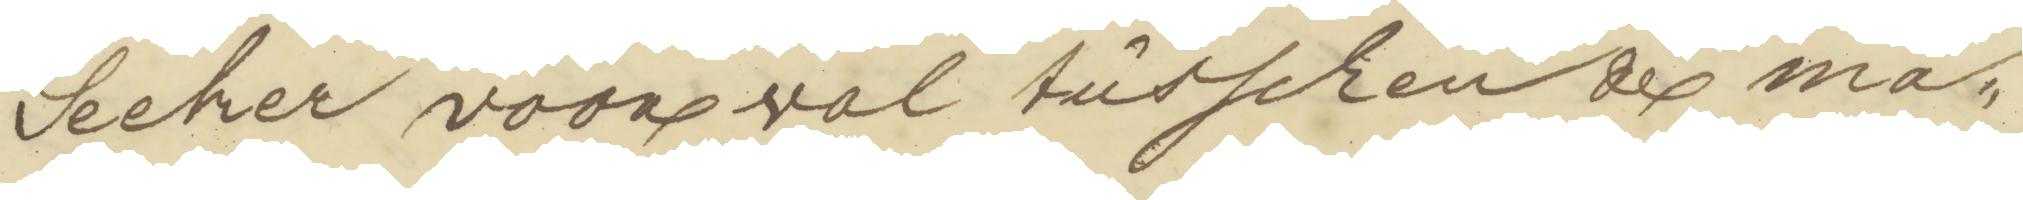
seeker voor val tusschen de ma„
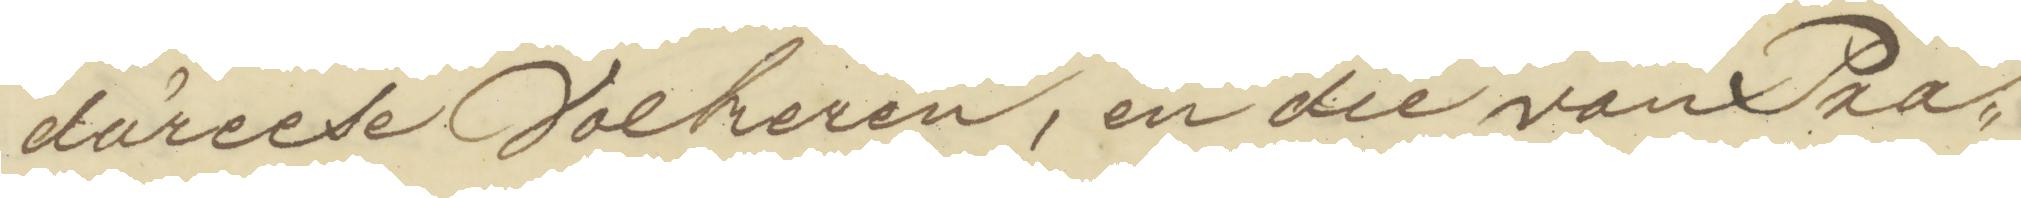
dureese Volkeren, en die van Pra„
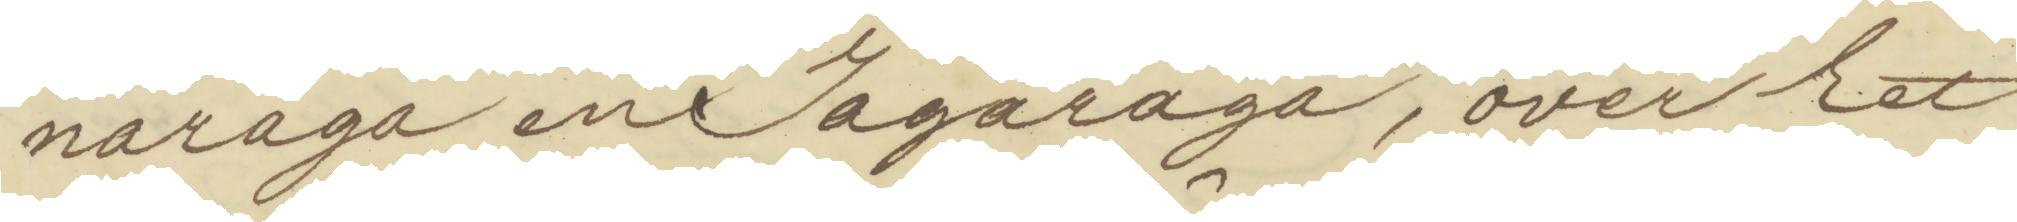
naraga en Iagaraga, over het
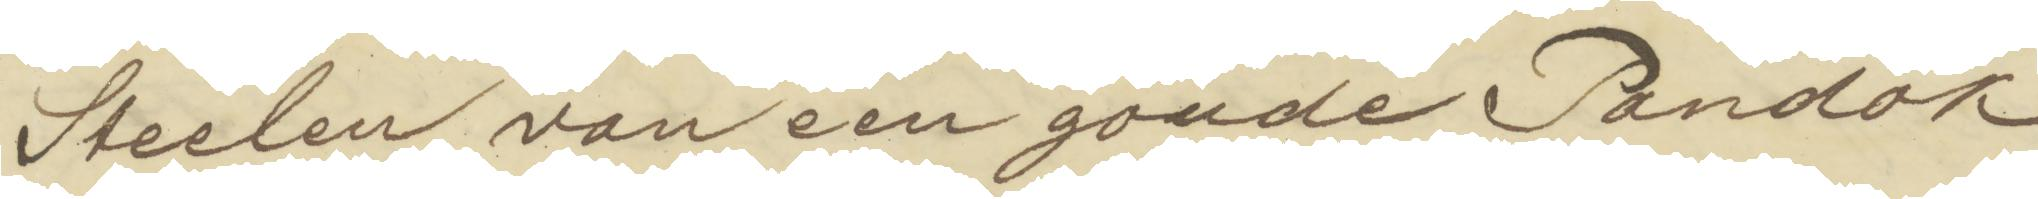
steelen van een goude Pandok
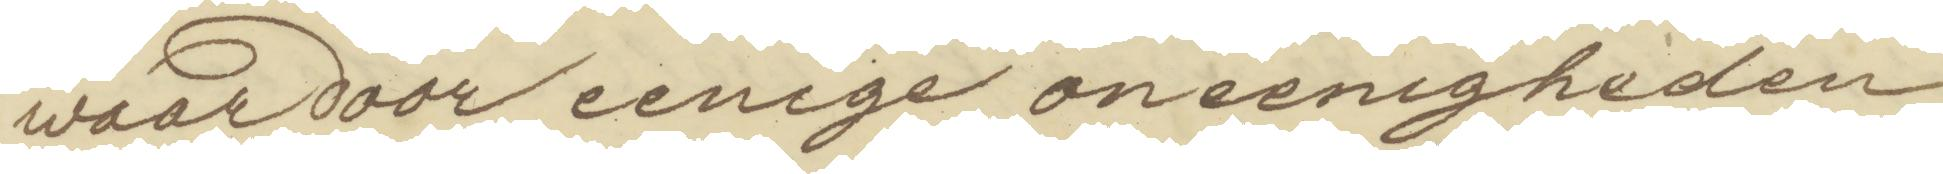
waar door eenige oneenigheden
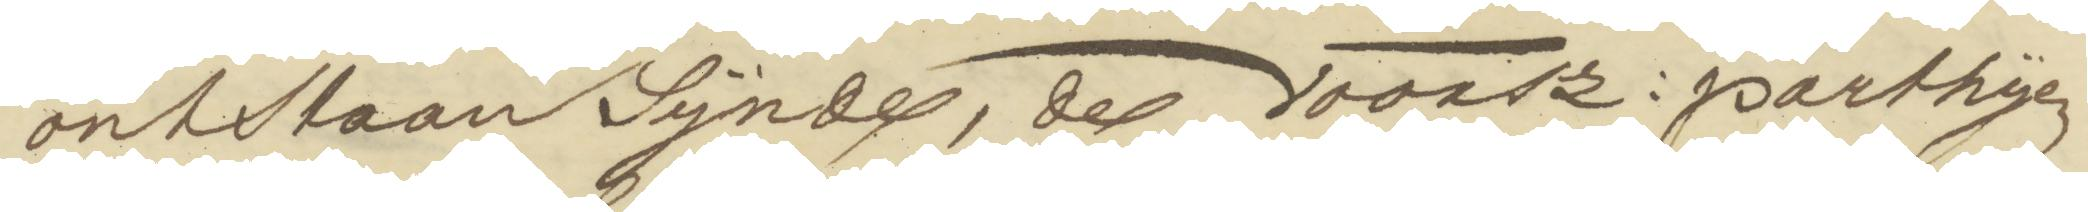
ontstaan sijnde, de voorsz: parthijen
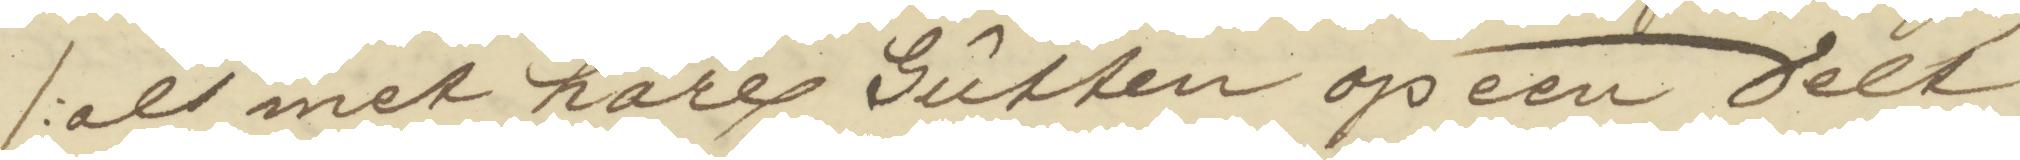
/:als met hare hutten op een Velt
